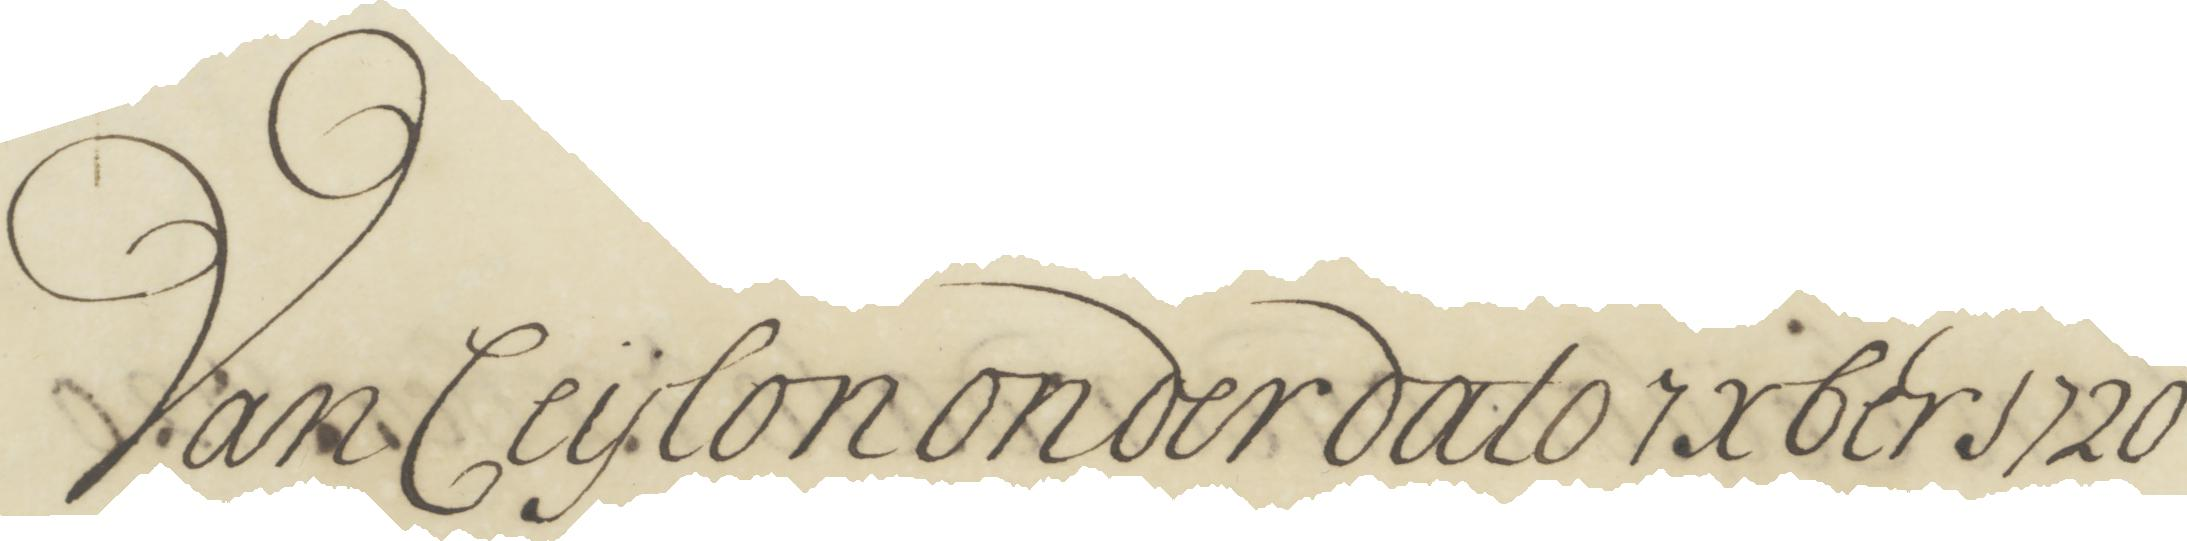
Van Ceijlon onder dato 7 xber 1720
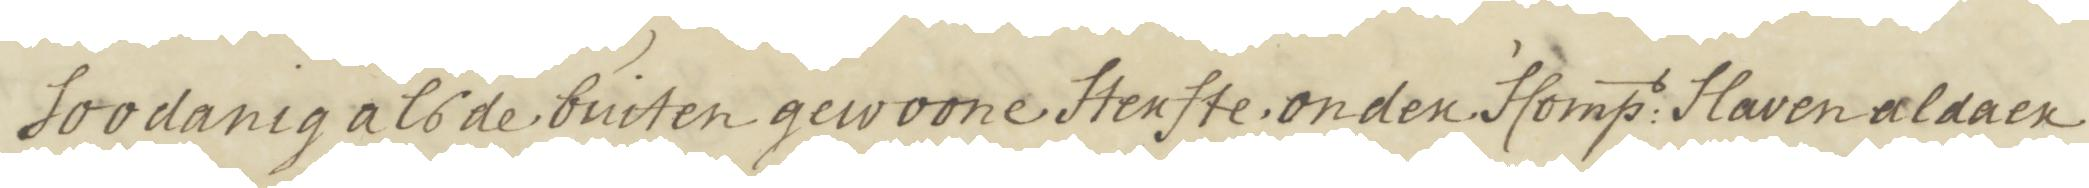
soodanig als de buiten gewoone sterfte onder 'sComp: slaven aldaer
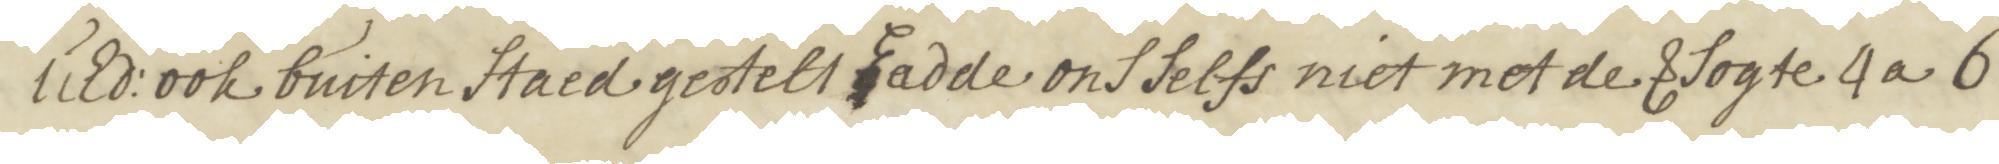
uEd: ook buiten staed gestelt hadde ons selfs niet met de versogte 4 a 6
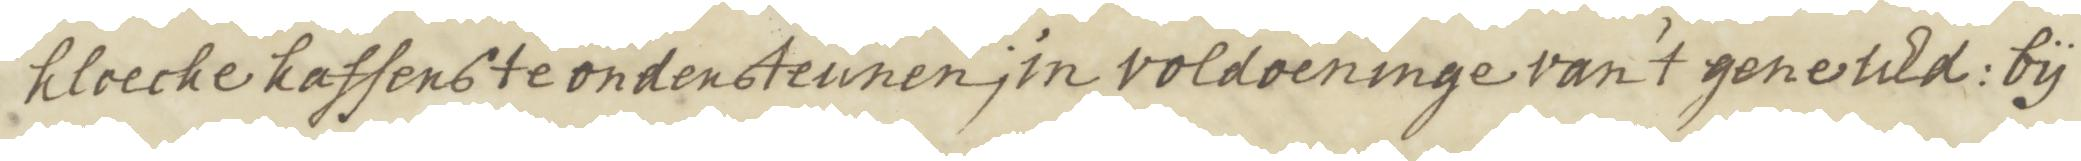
kloecke kaffers te ondersteunen, in voldoeninge van ’t gene uEd: bij
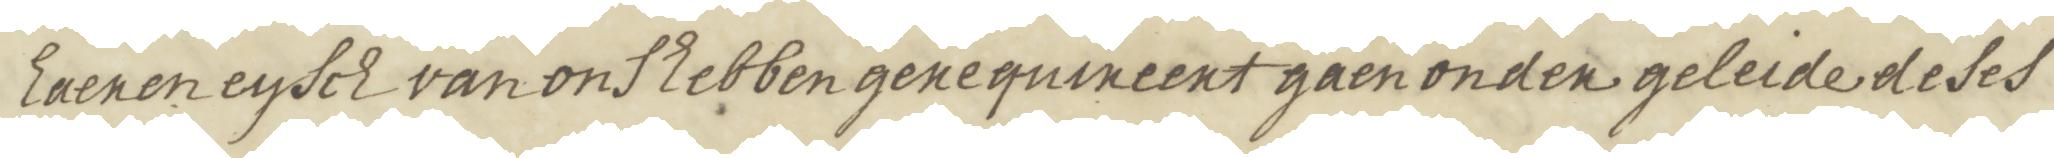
haeren eysch van ons hebben gerequireert gaen onder geleide deses
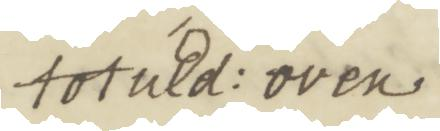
tot uEd: over
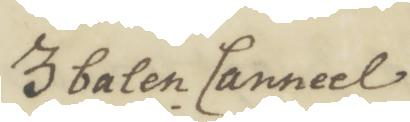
3 balen Canneel
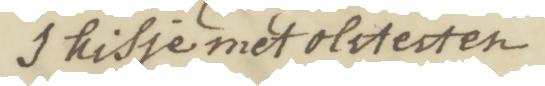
1 kisje met oliteiten
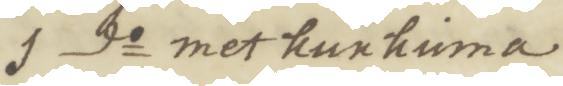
1 _=o met kurkuma
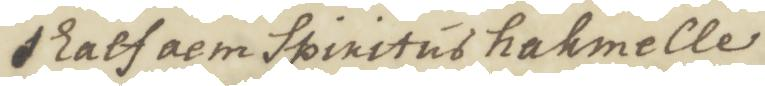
1 half aem spiritus hakmelle
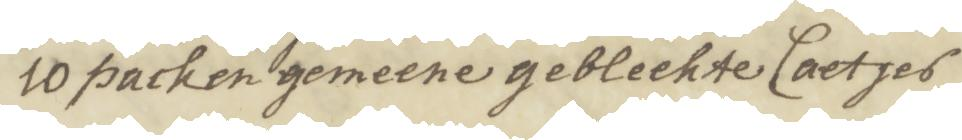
10 packen gemeene gebleekte Caetjes
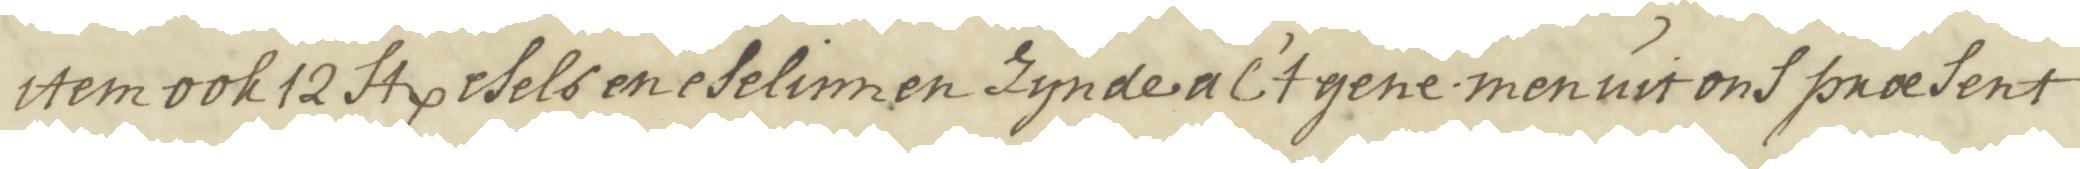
item ook 12 stx esels en eselinnen zynde al ’t gene men uit ons praesent
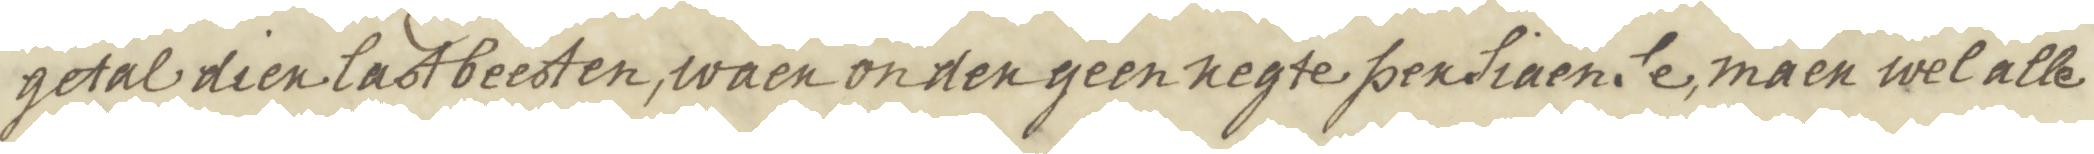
getal dier lastbeesten, waer onder geen regte persiaense, maer wel alle
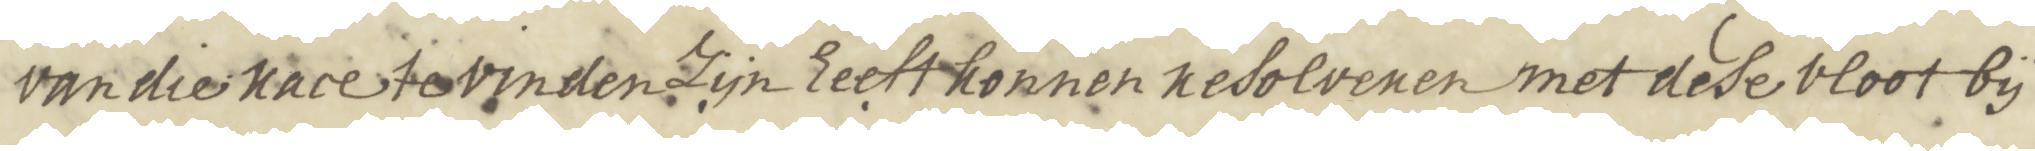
van die race te vinden zijn heeft konnen resolveren met dese vloot bij
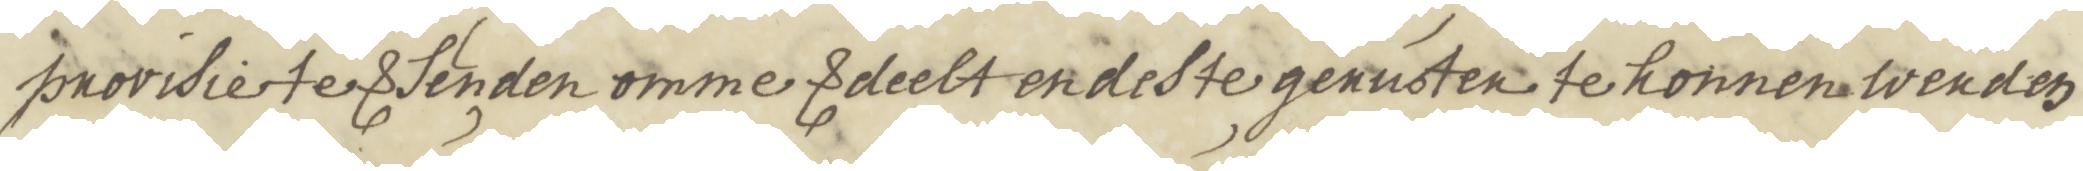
provisie te versenden omme verdeelt en des te geruster te konnen werden
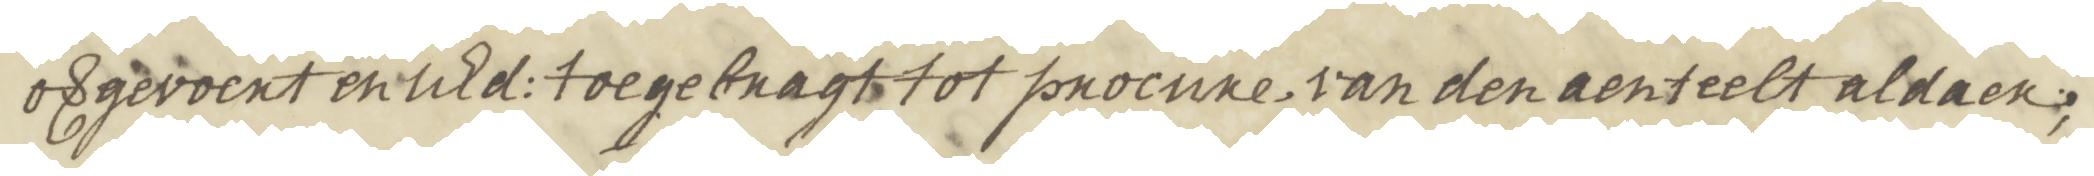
overgevoert en uEd: toegebragt tot procure van den aenteelt aldaer;
